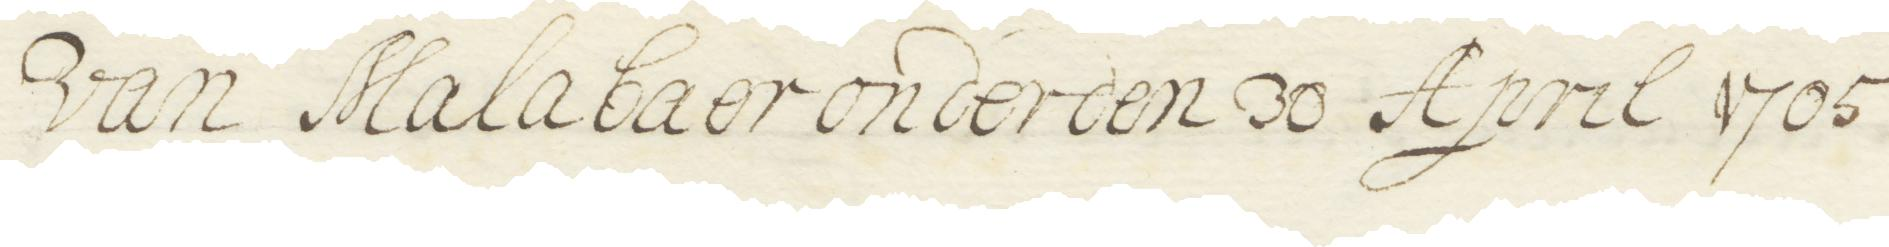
van Malabaer onder den 30 April 1705
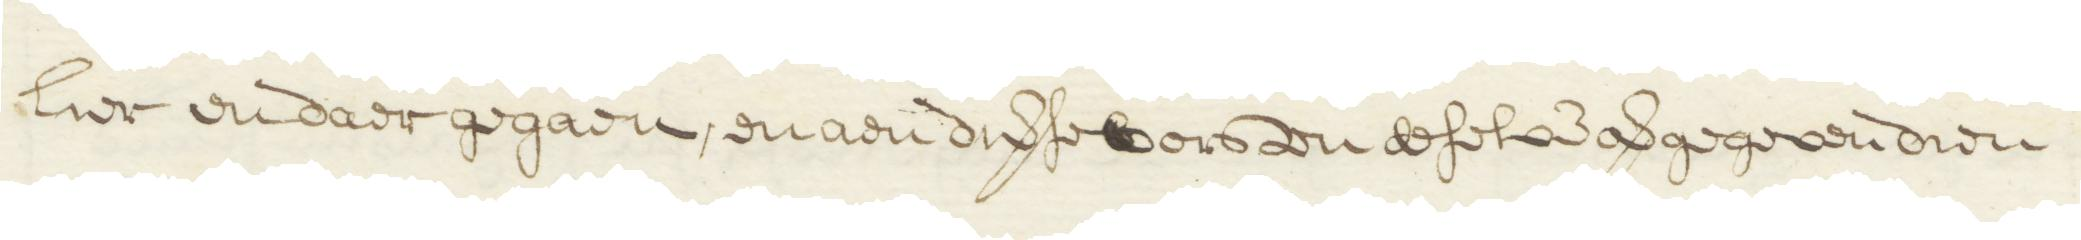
hier en daer gegaen, en aen diverse borsten deselve overgegeven dien
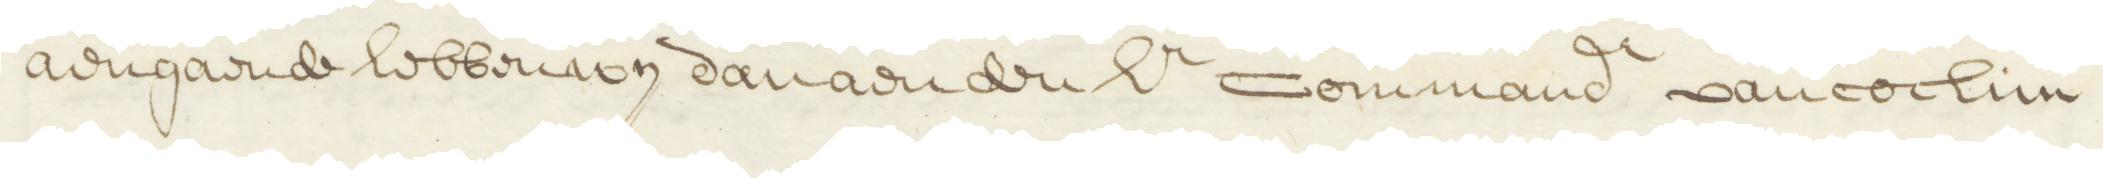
aengaende hebben wy dan aen den hr commandr van cochim
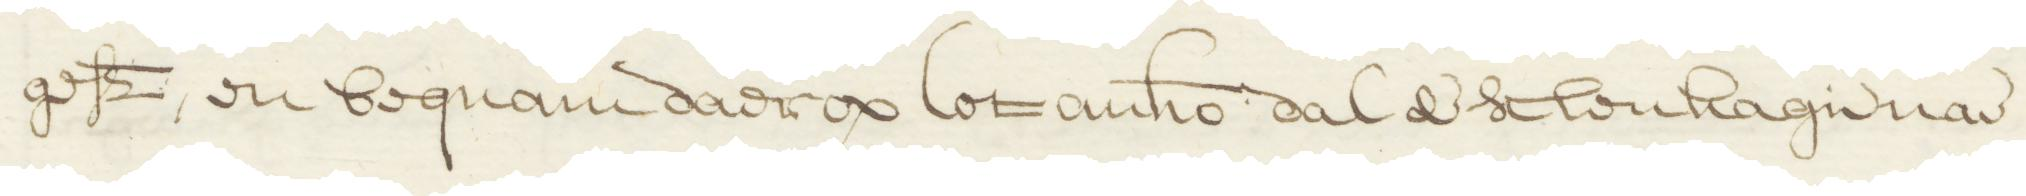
gesz, en bequam daer op tot anko: dat de schenkagie nae
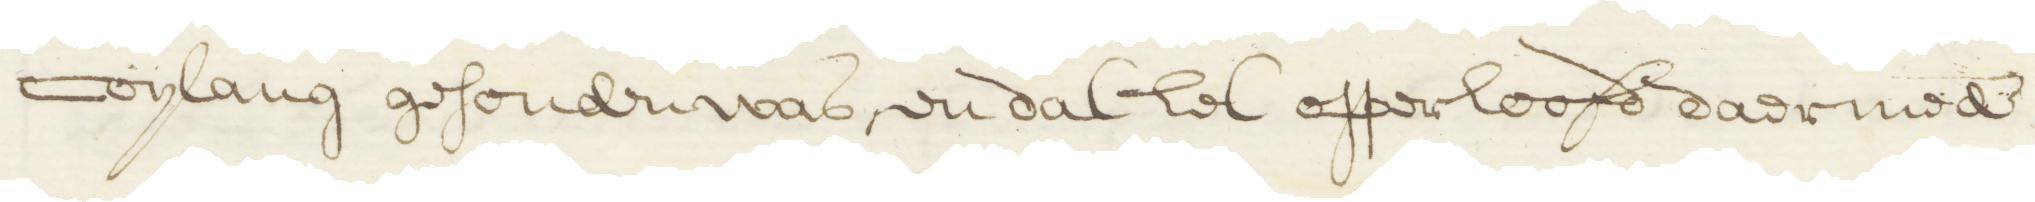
coijlang gesonden was, en dat het opperhoofd daermede
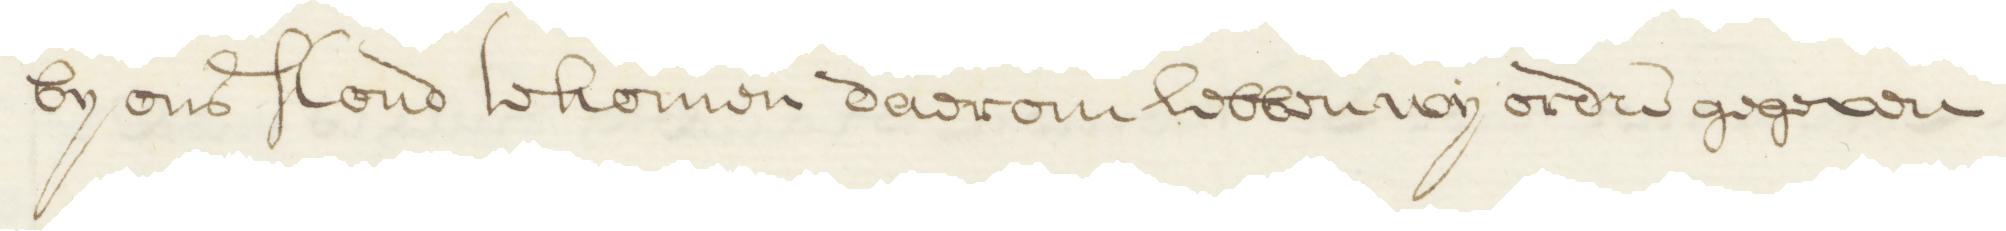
by ons stond te komen daerom hebben wij ordre gegeven
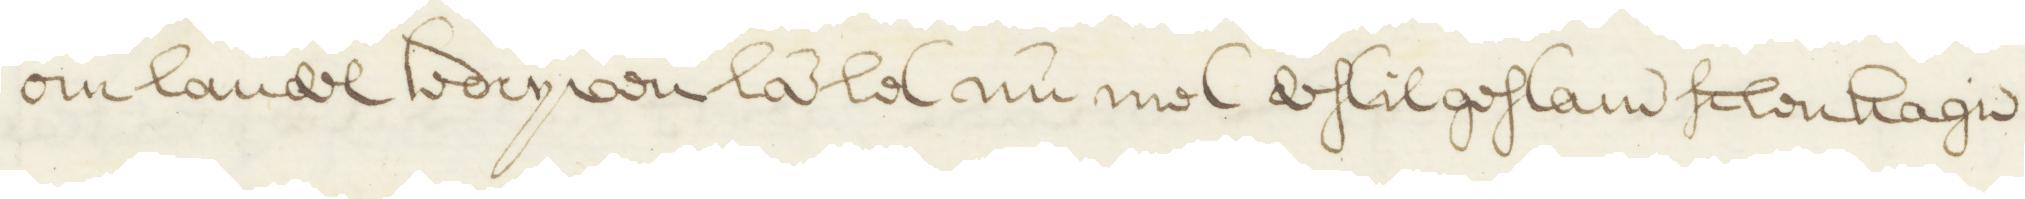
om handel te dryven hoe het nu met de stil gestane schenkagie
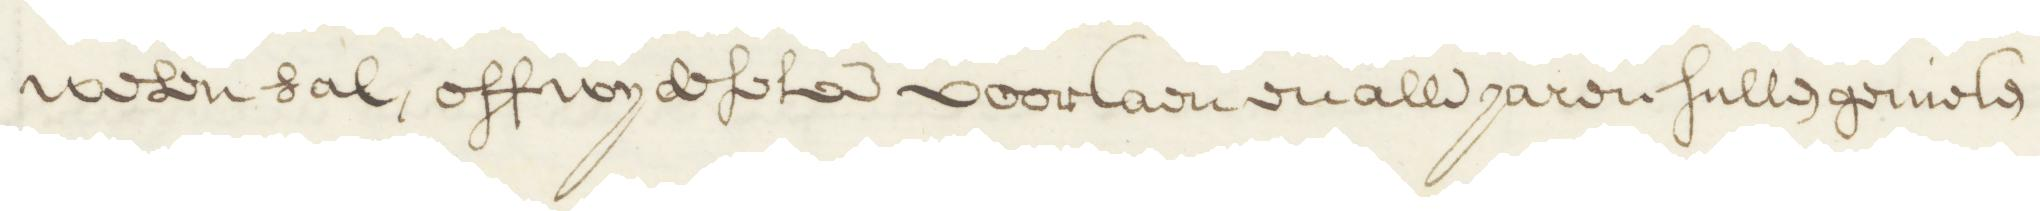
wesen sal, off wy deselve voortaen en alle jaren sullen genieten
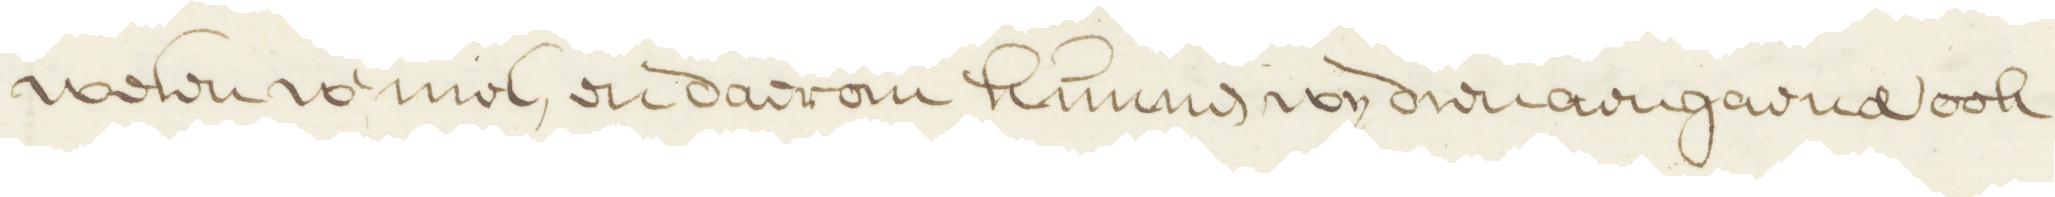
weten w' niet, en daerom kunnen wy dienaengaende ook
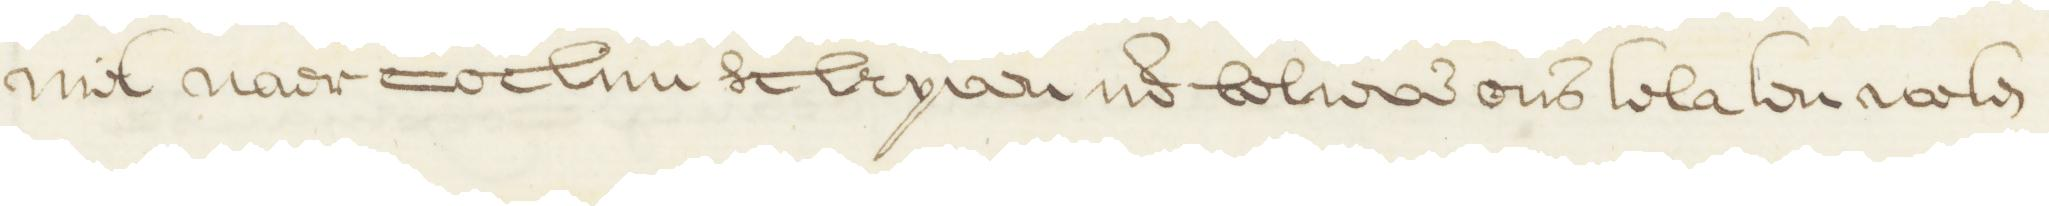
niet naer cochim schryven uE believe ons te laten weten
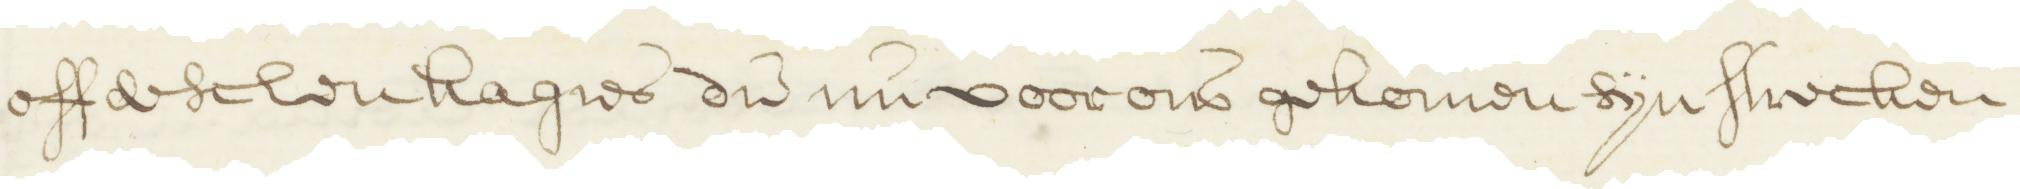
off de schenkagies die nu voor ons gekomen sijn strecken
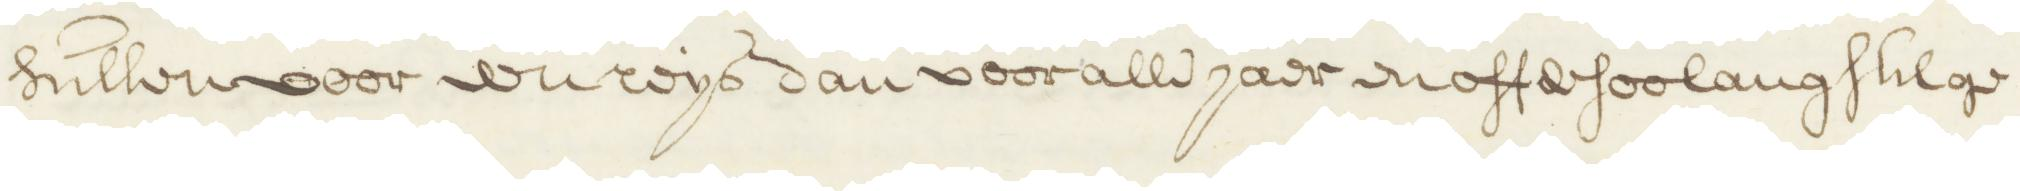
sullen voor een reijs dan voor alle jaer en off de soo lang stil ge
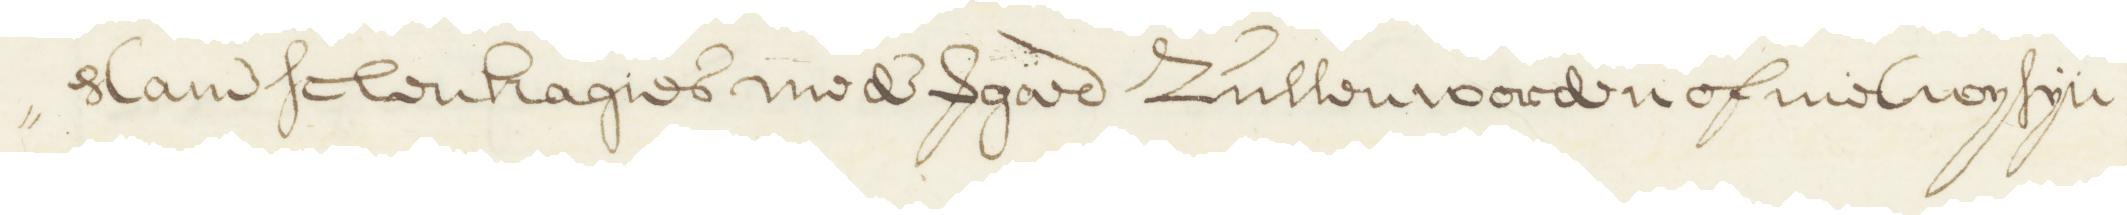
„stand schenkagies mede vergoed zullen worden of niet wy sijn
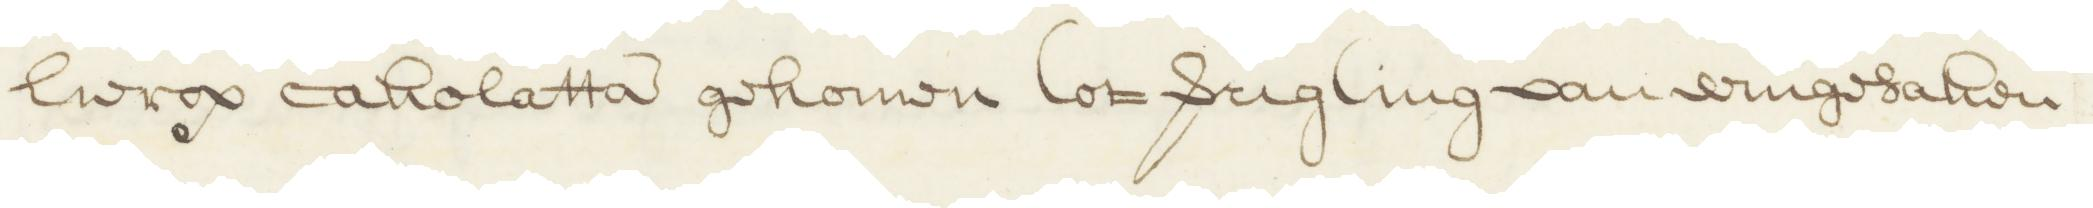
hierop cakolatta gekomen tot verrigting van eenige saken
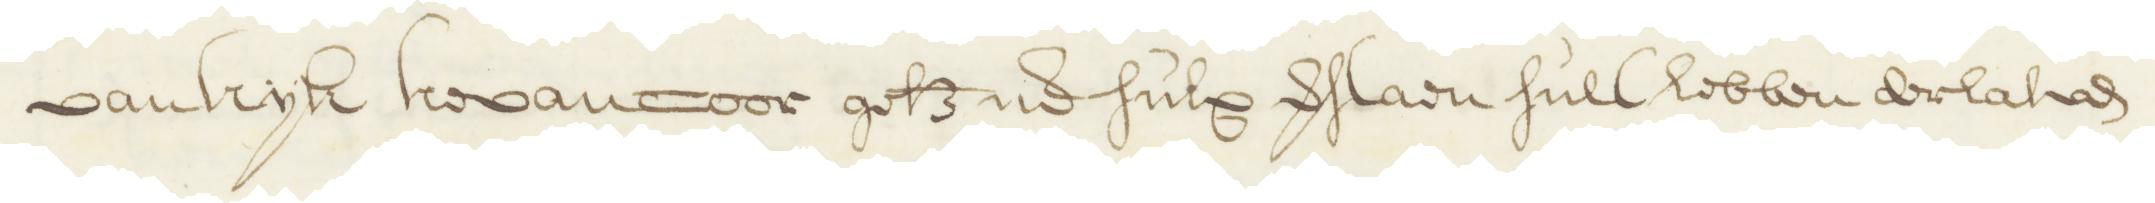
van kijk kevancoor gelijk uE sulx verstaen sult hebben derhalven
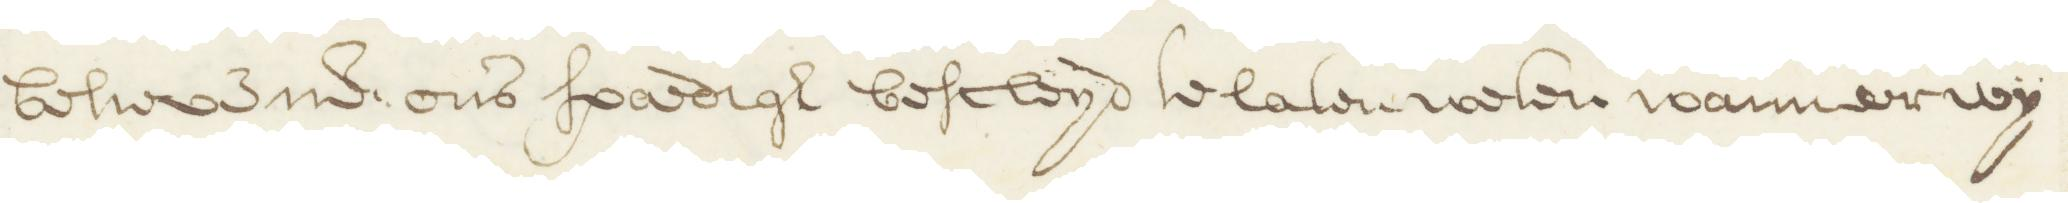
believen uE: ons spoedigh bescheijd te laten weten wanneer wij
